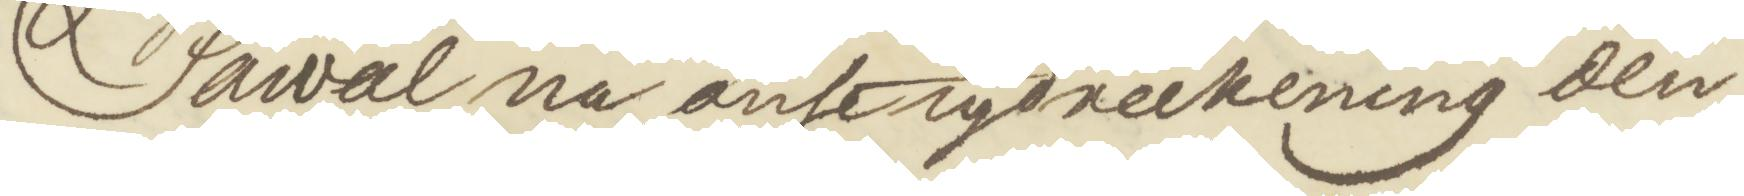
Sawal na onse tijdreekening den
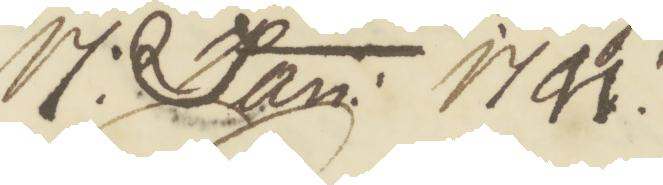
17: Jan: 1741.
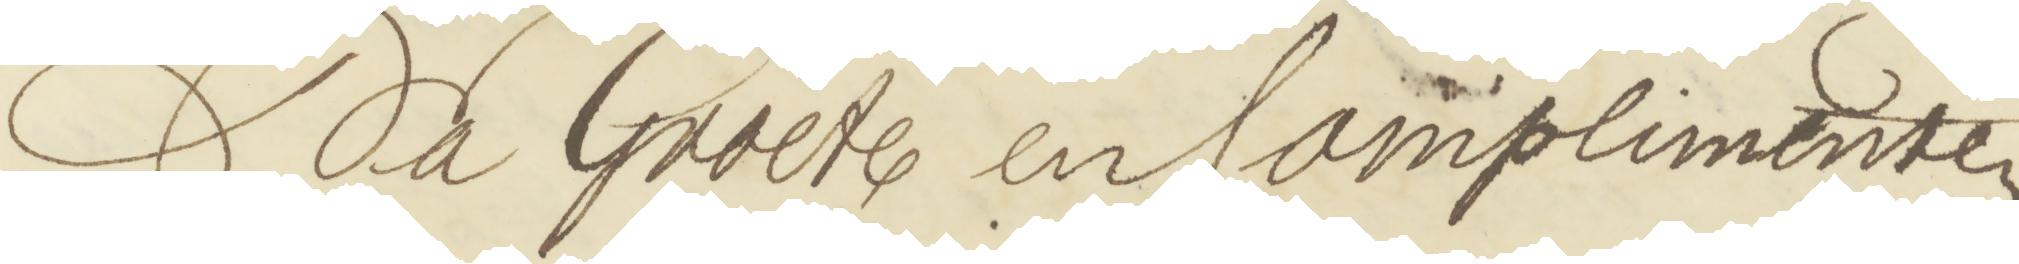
da Groete en Complimenten
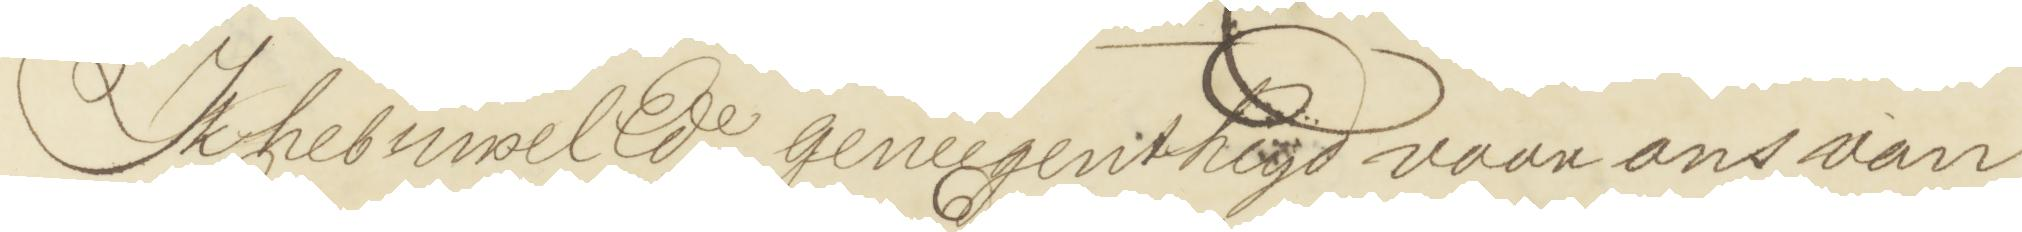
Ik heb uwel Ed=e geneegentheijd voor ons van
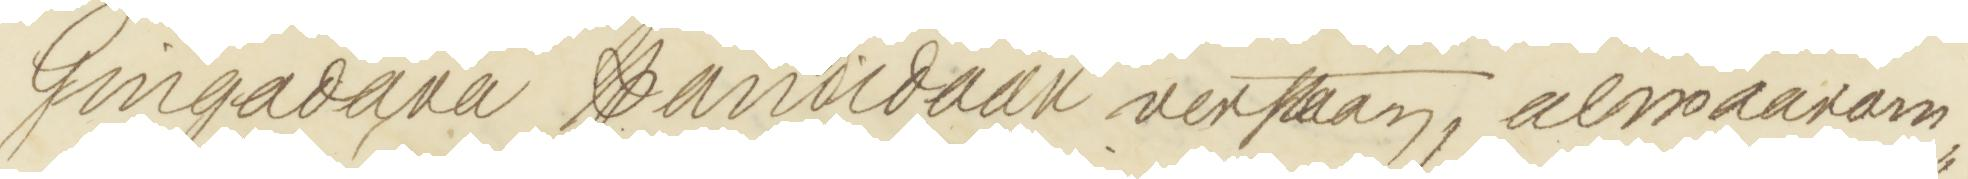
Gingadara Pandidaar verstaan, alwaarom„
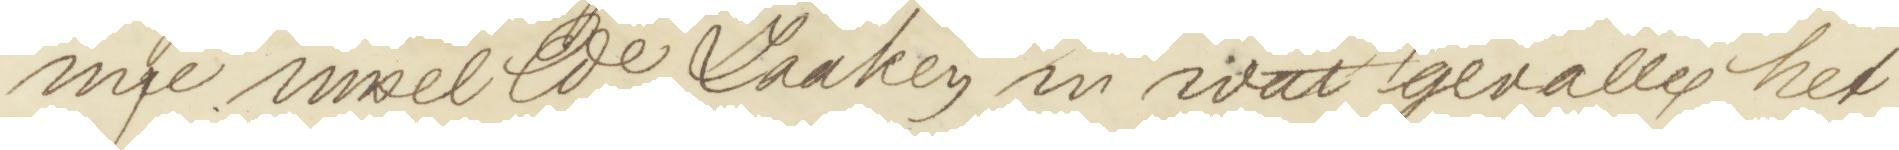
mje uwel Ed„e zaaken in wat gevalle het
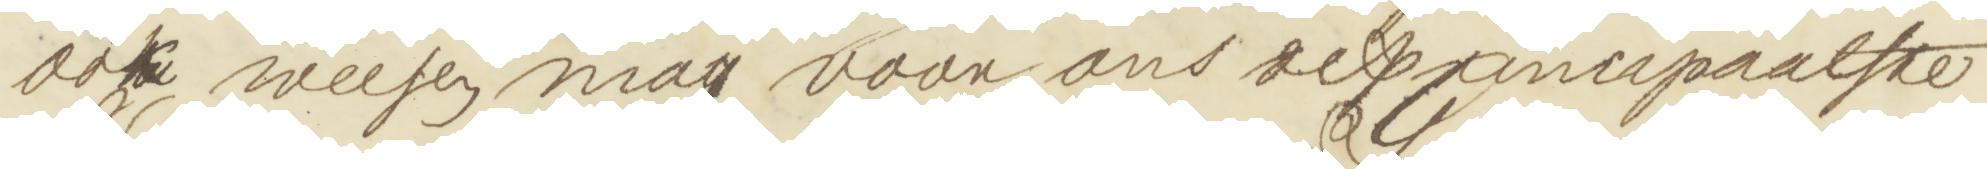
ook weesen mag voor ons de principaalste
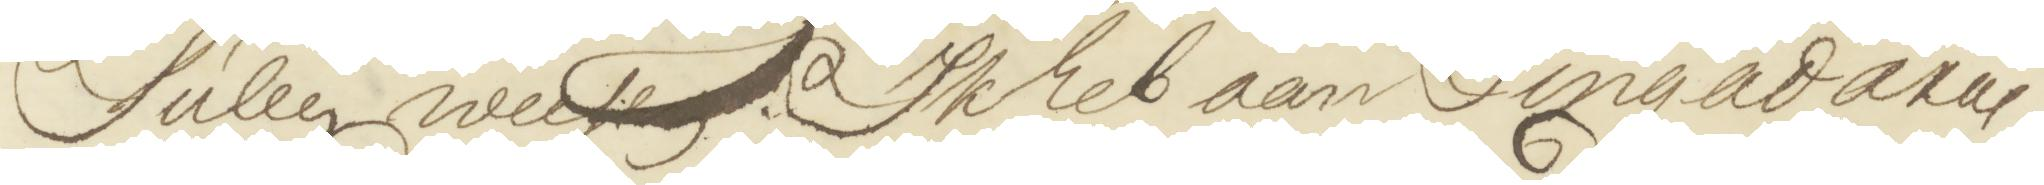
sullen weesen. Ik heb aan Gingadara
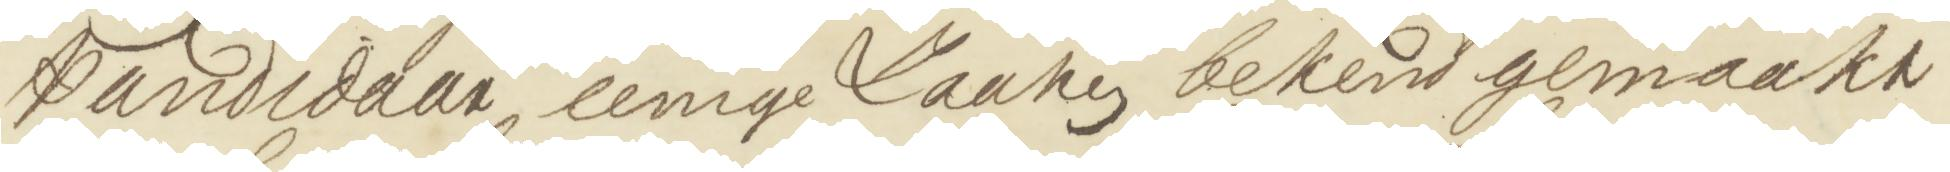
pandidaar eenige zaaken bekend gemaakt
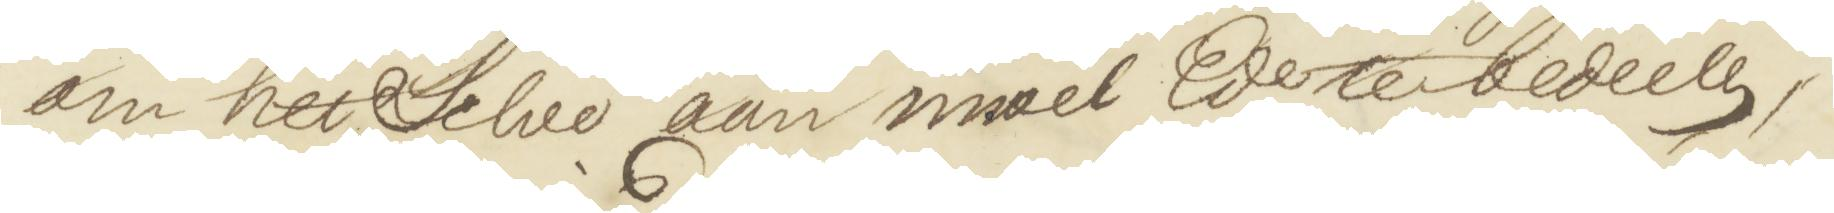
om het schee aan uwel Ed„e te bedeelen,
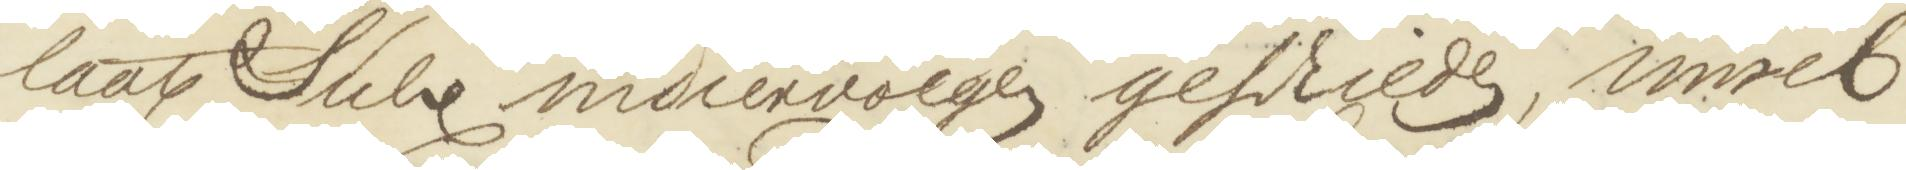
laat sulx indiervoegen geschieden, uwel
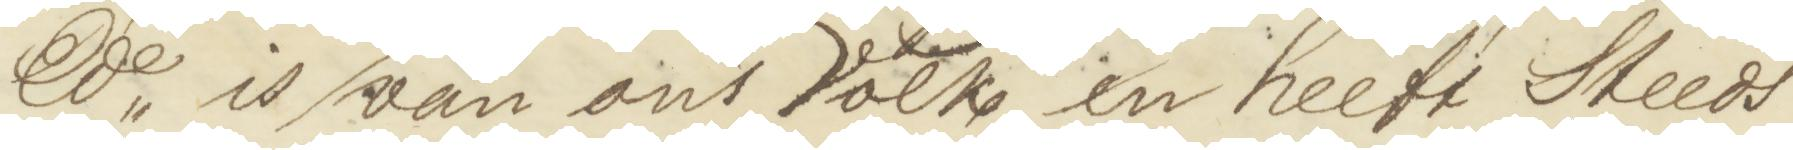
Ed„e is van ons Volk en heeft steeds
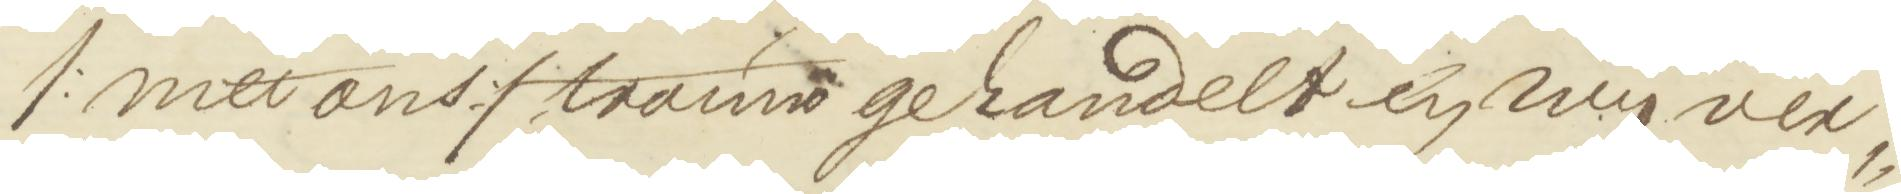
/:met ons:/ trouw gehandelt en wij ver„
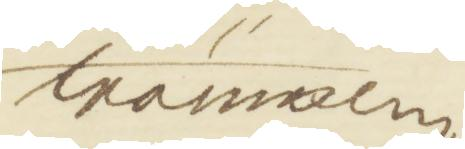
trouwen
